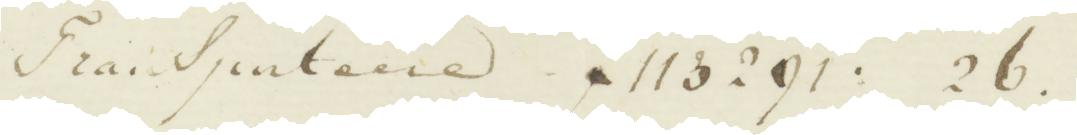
Transporteere - ƒ 113291: 26.
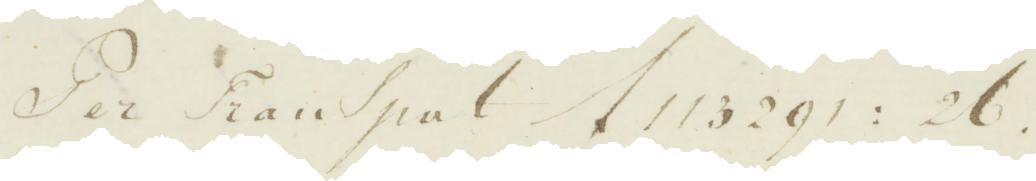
Per Transport ƒ 113291: 26.
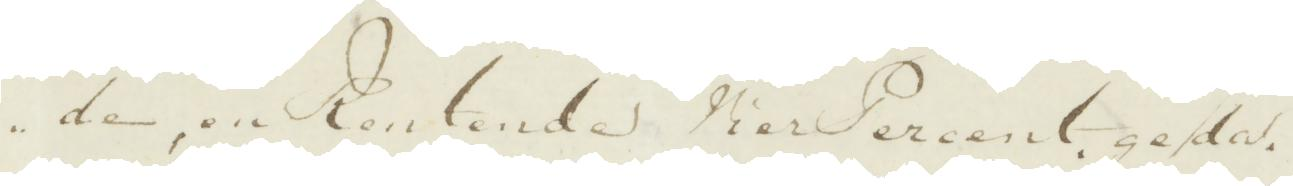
„de, en Rentende, Vier Percent, geda.
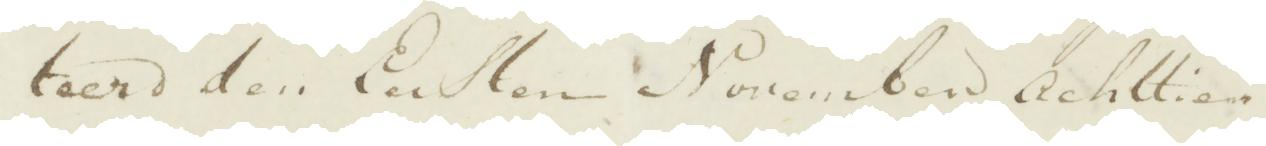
teerd den Eersten November Achttien
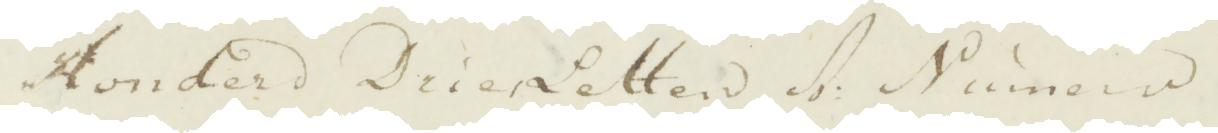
Honderd Drie, Letter A: Numero
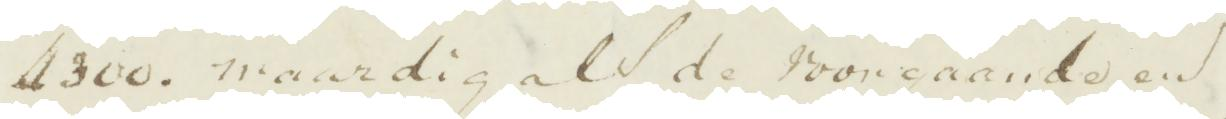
4300. waardig als de voorgaande en
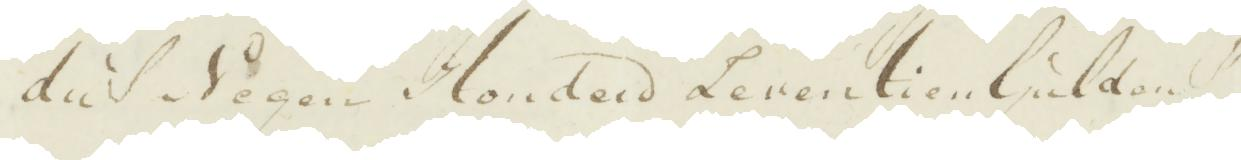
dus Negen Honderd Zeventien Guldens
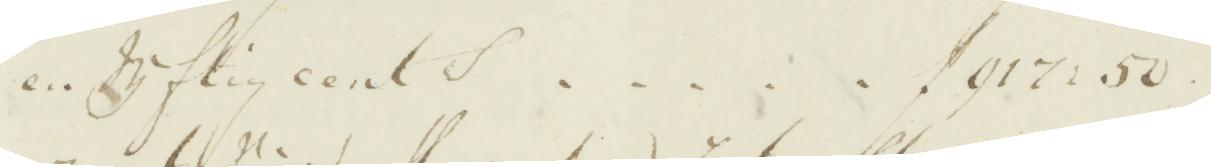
en Vijftig cents . - - . . ƒ 917: 50.
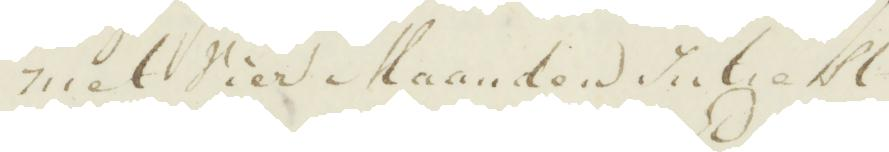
met Vier Maanden Intrest
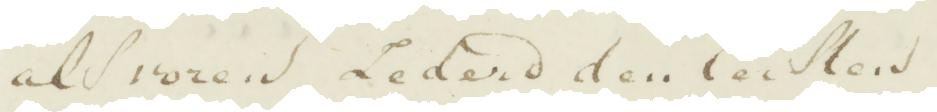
als voren zederd den Eersten
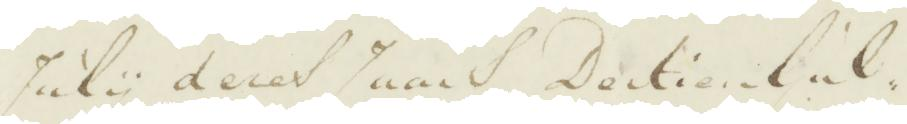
Julij dezes Jaars Dertien Gul„
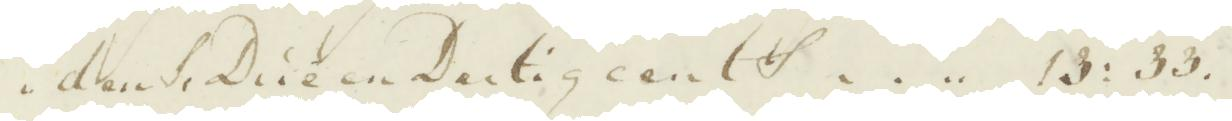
„dens, Drie en Dertig cents . . .. 13:33.
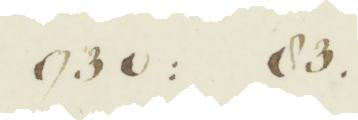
930: 83.
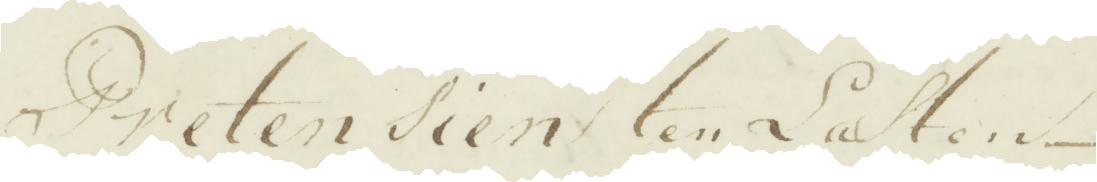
Pretensien ten Lasten—
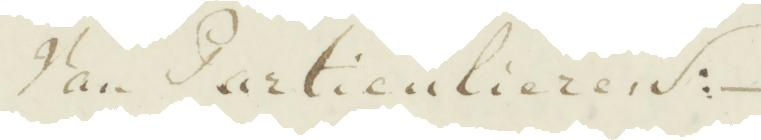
Van Particulieren:—
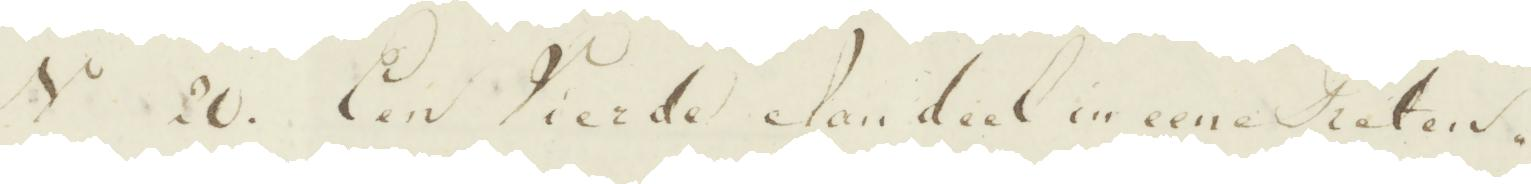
N 20. Een Vierde Aan deel in eene Preten„
